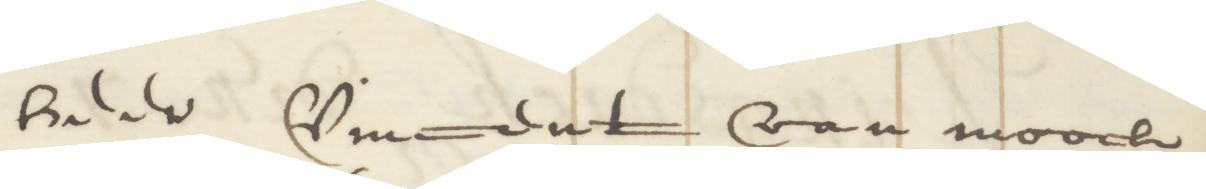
heer vincent van moock
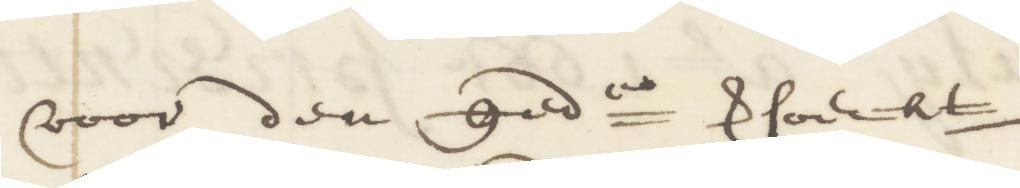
voor den ged=e versoeckt
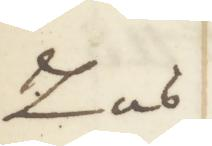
Zas
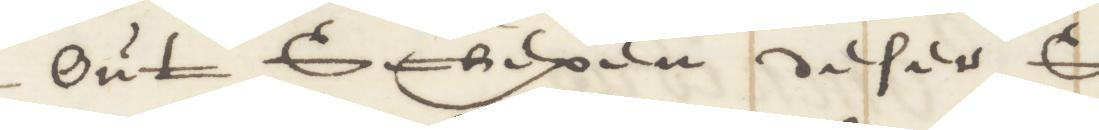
Out Schepen deses S
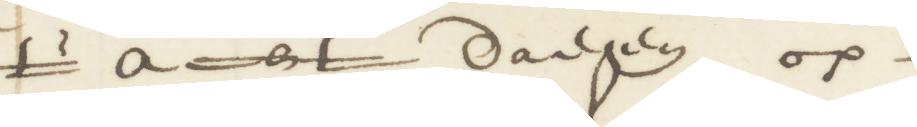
t' acht daegen op
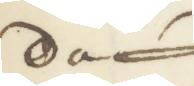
dac
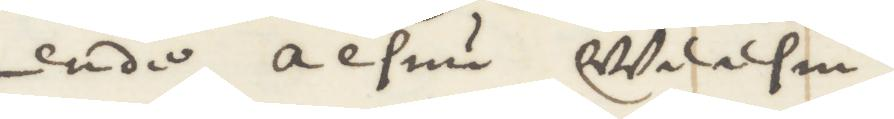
ende alsnu weesm
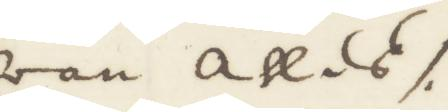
van alles/.
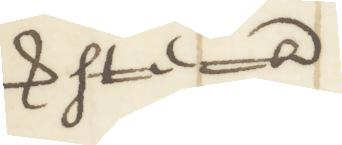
versteck
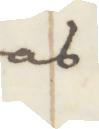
as
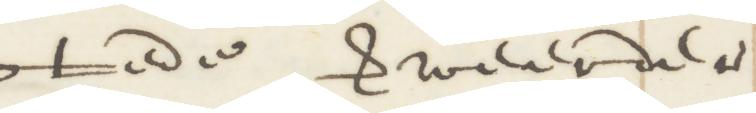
tede verweerder
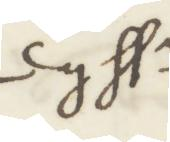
eijss
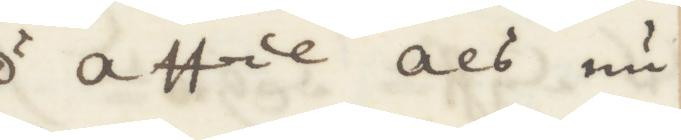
d' appel als nu
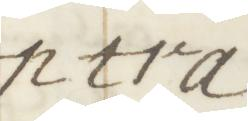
ntra
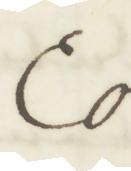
Co
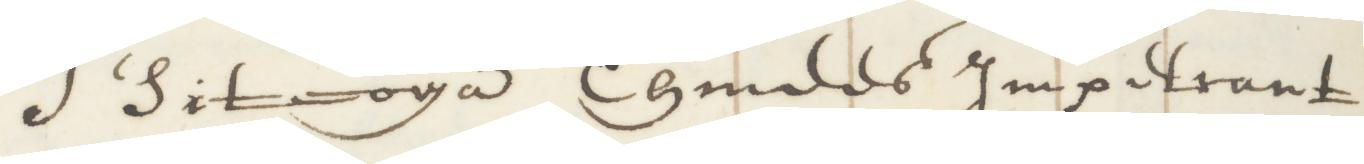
T 'sitcoija Chinees Jmpetrant
